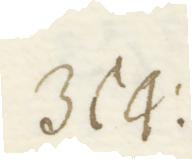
354:
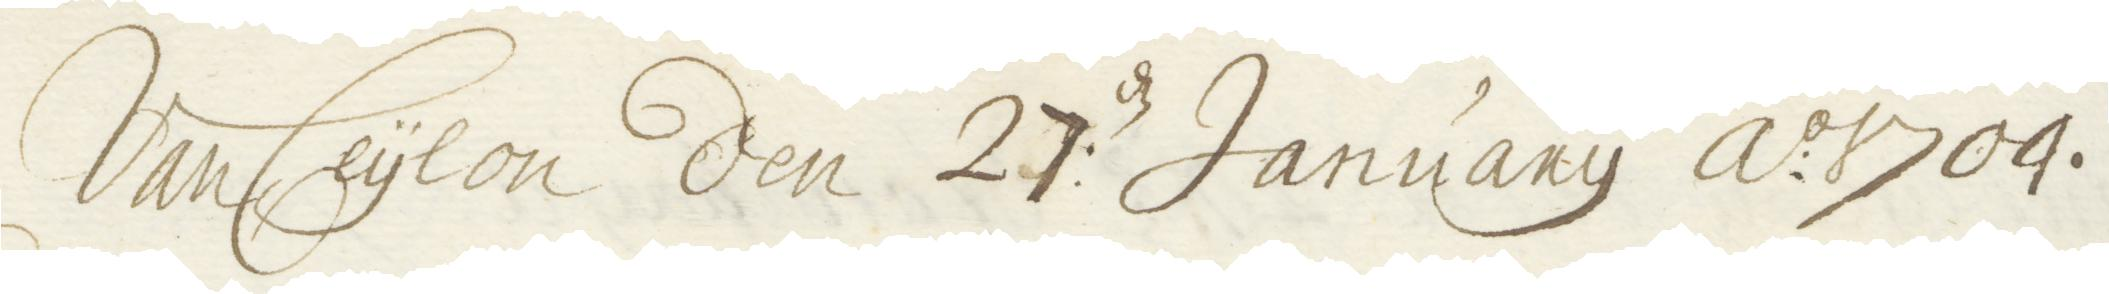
Van Ceijlon den 27:en Januarij A:o 1704.
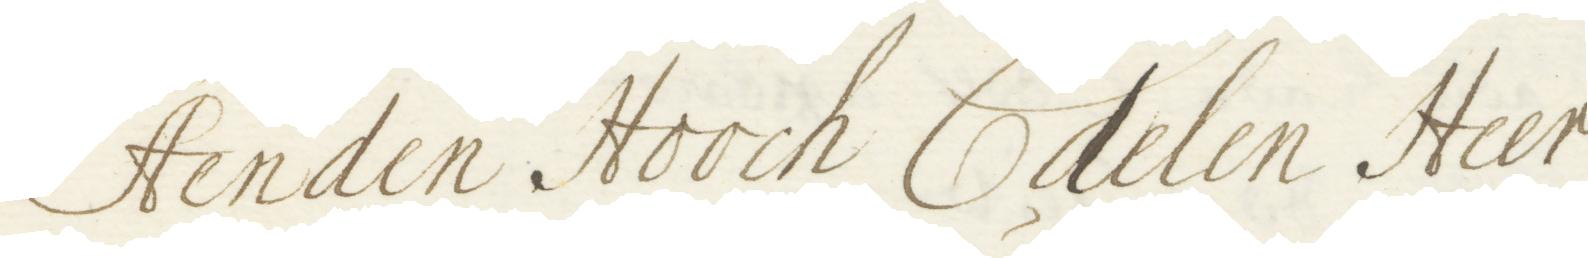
Aen den Hooch Edelen Heer
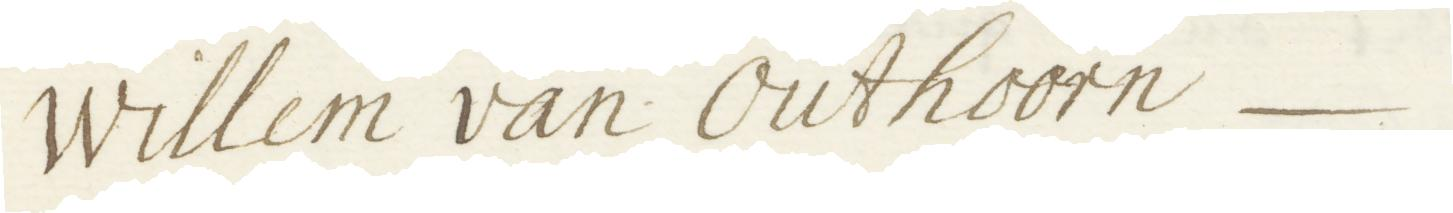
Willem van Outhoorn —
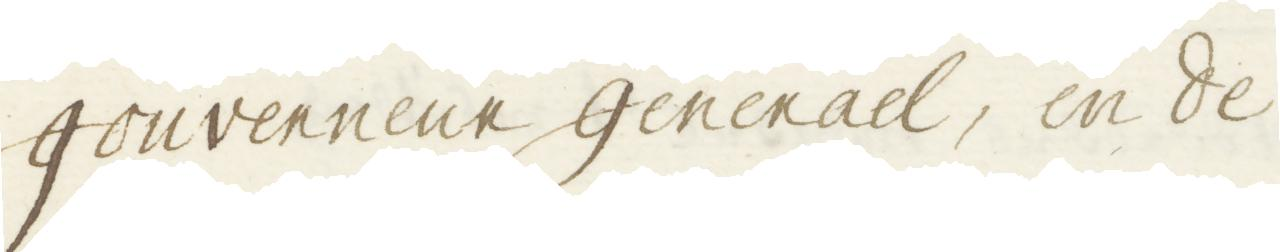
gouverneur generael, en de
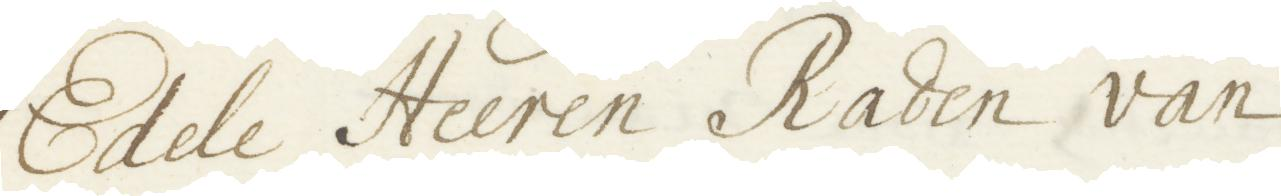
Edele Heeren Raden van
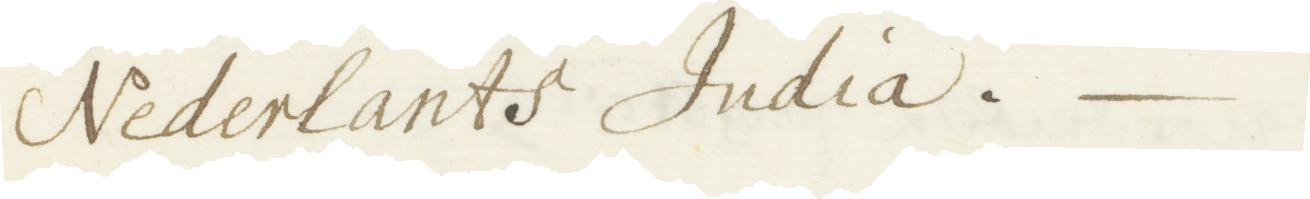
Nederlants Jndia. —
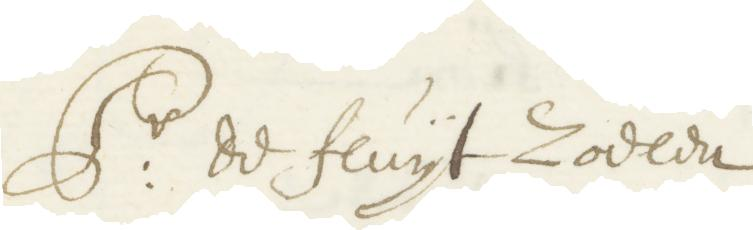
P:r de fluijt zoelen
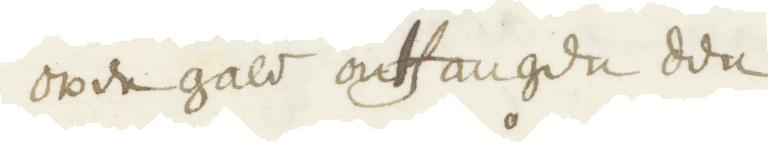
over gale ontfangen den
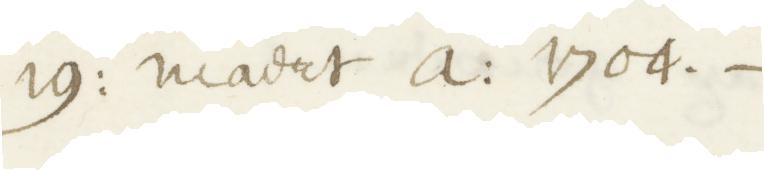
19: maert a:o 1704.—
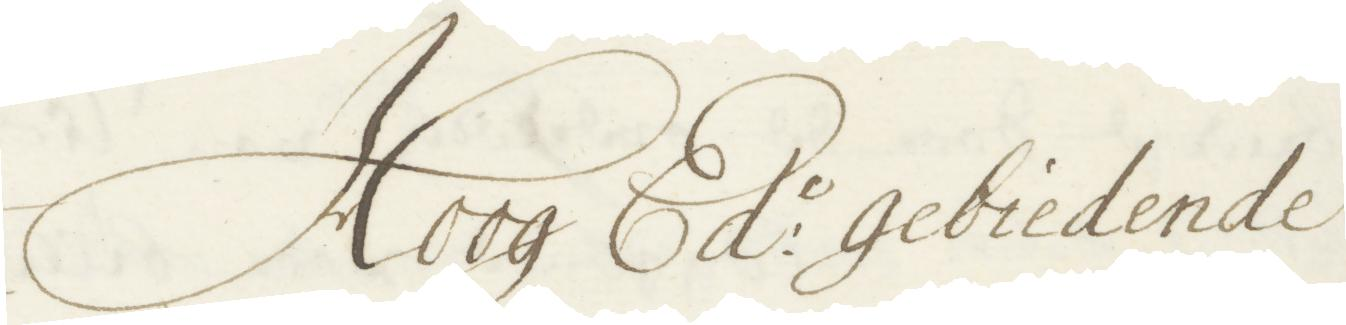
Hoog Ed:e gebiedende
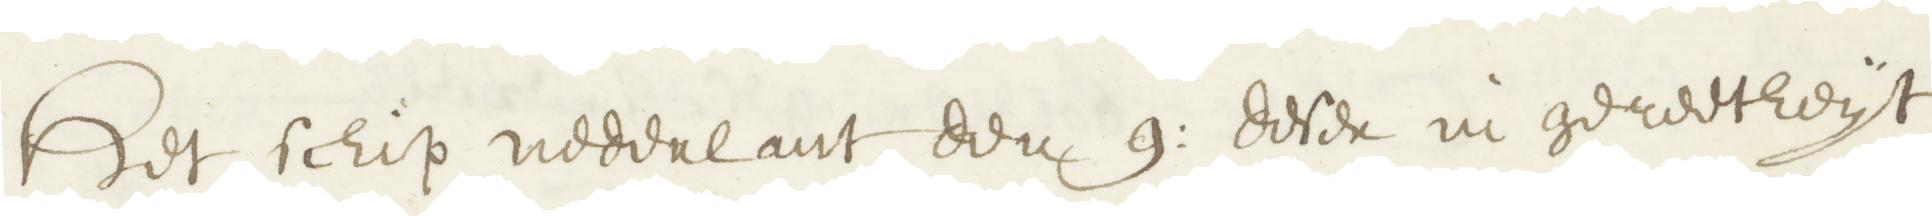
Het schip nederlant den 9: deser in gereetheijt
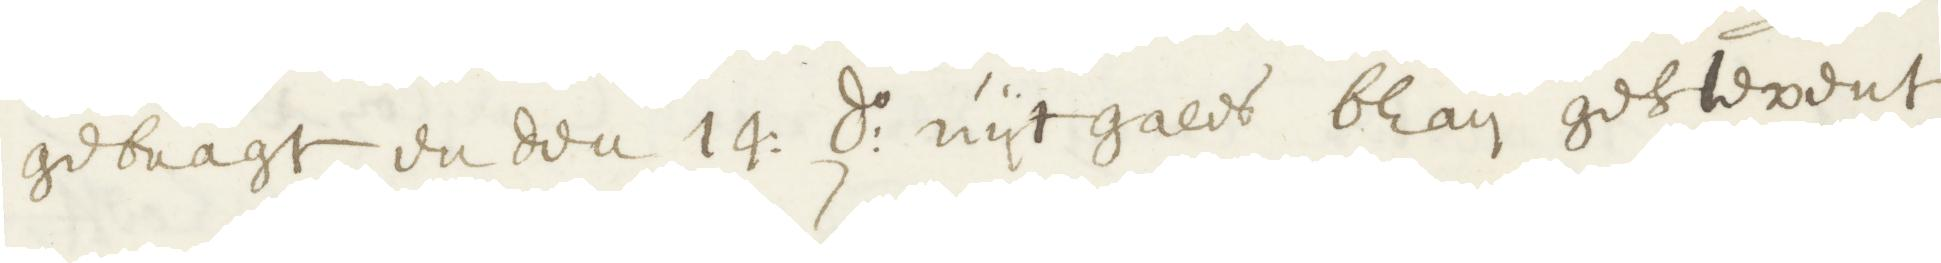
gebragt en den 14: d:o uijt gales bhaij gestevent
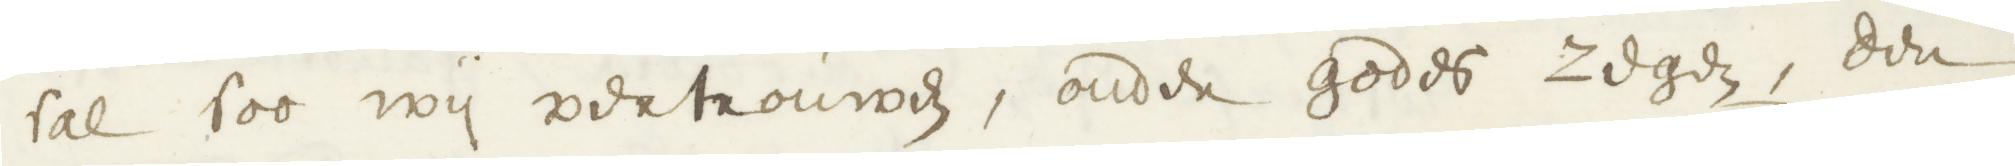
sal soo wij vertrouwen, onder godes zegen, den
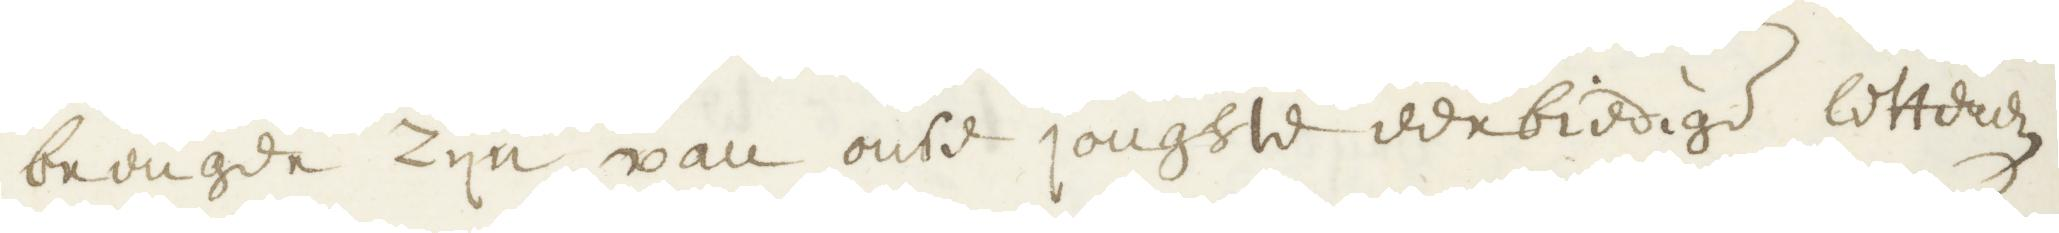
brenger zijn van onse jongste eerbiedige letteren
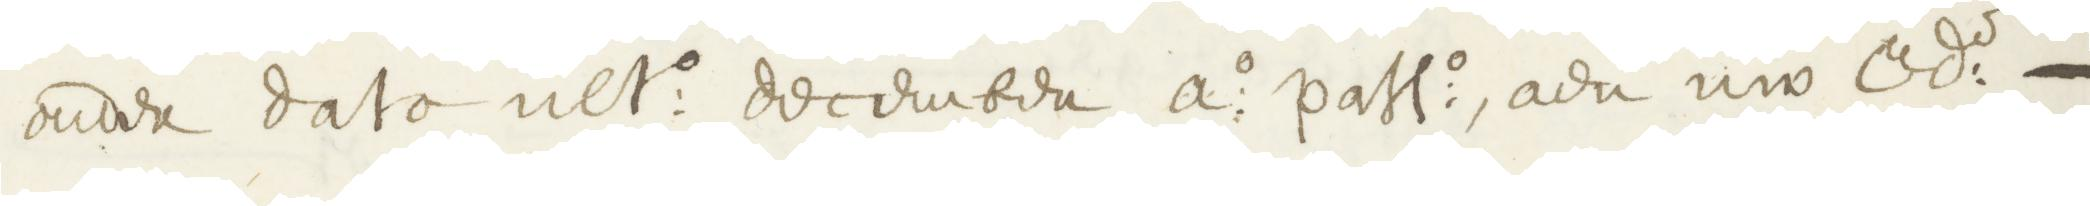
onder dato ult:o december a:o pass:o, aen uw Ed:e —
